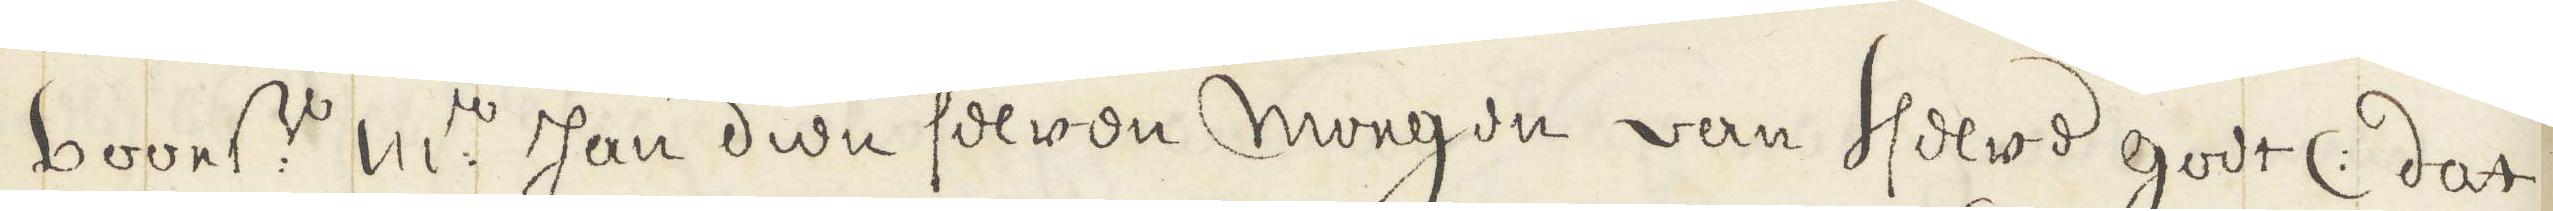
voorsz: m:r Jan dien selven morgen van tselve goet (: dat
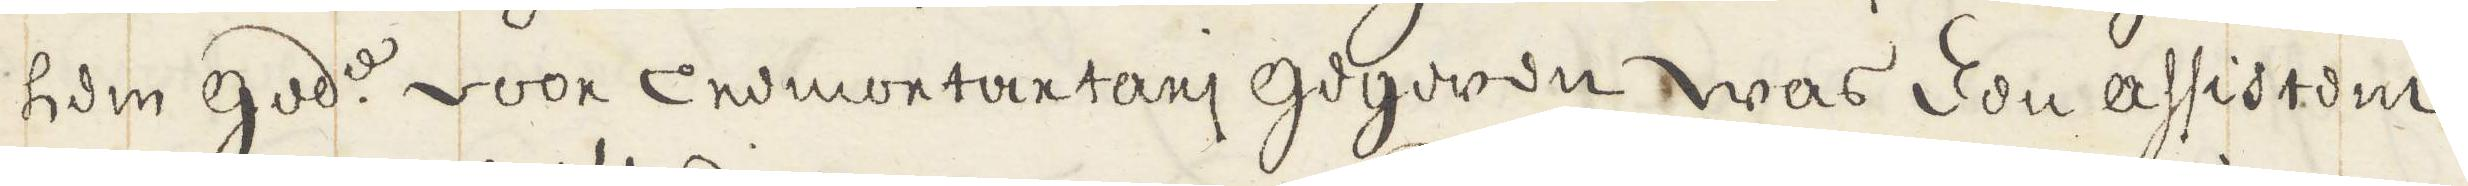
hem ged.e voor cremortartarj gegeven was Een assistent
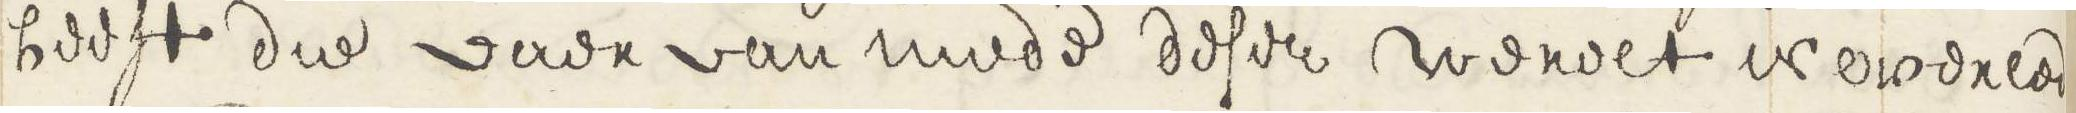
heeft die vaer van mede deser werelt is overled
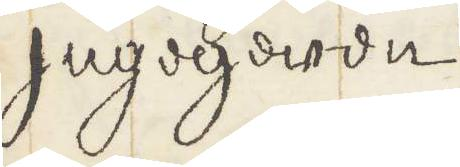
Jngegeven
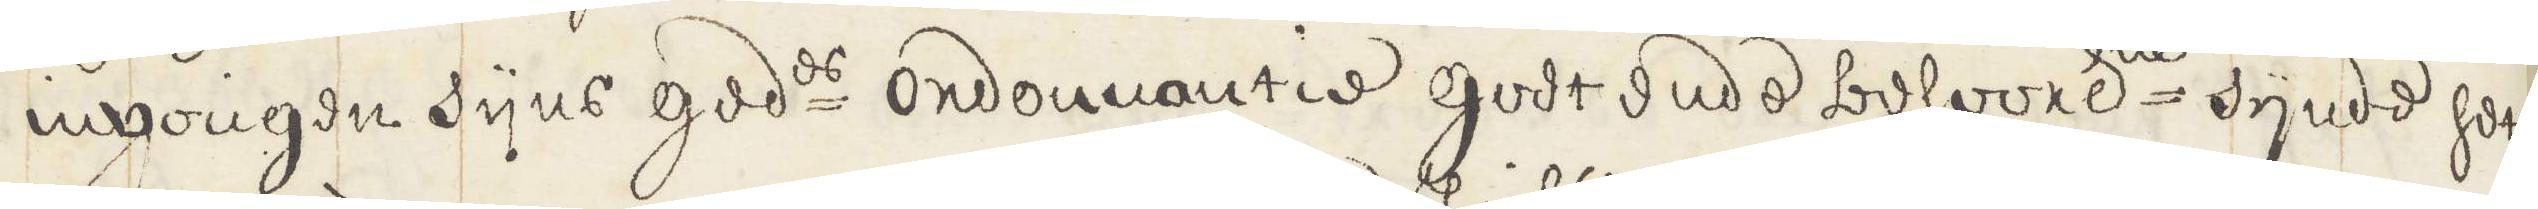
invougen sijns ged=es ordonnantie goet ende behoore=ne sijnde het
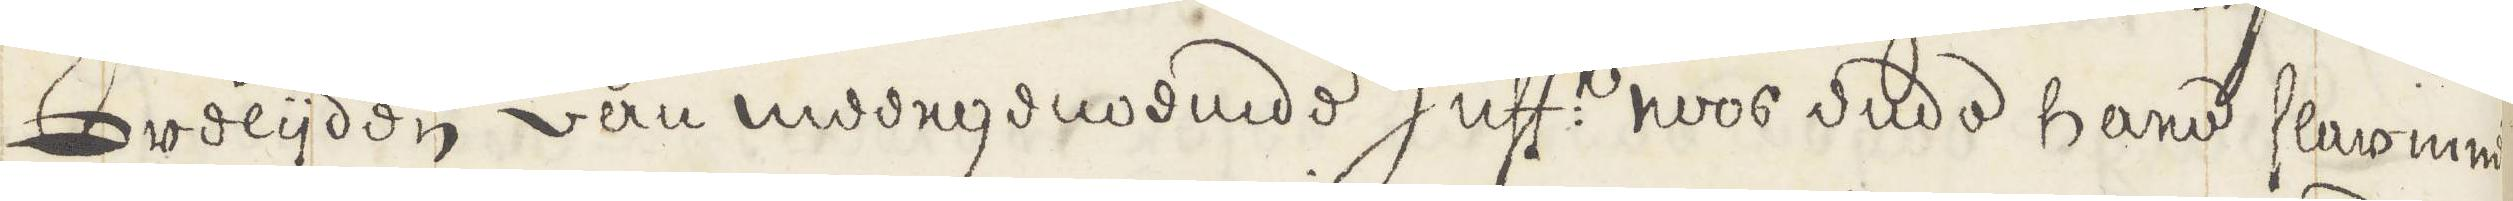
overlijden van meergenoemde juff:w roos ende hare slavinne
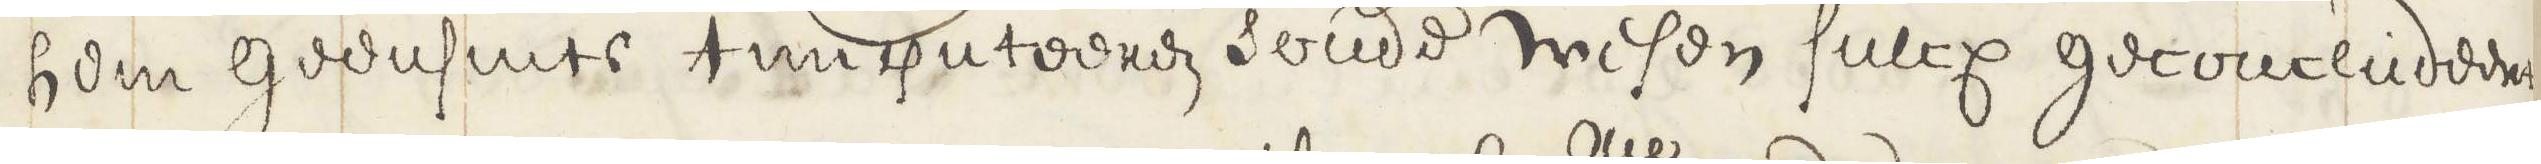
hem geensints timputeeren soude wesen sulcx geconcludeer
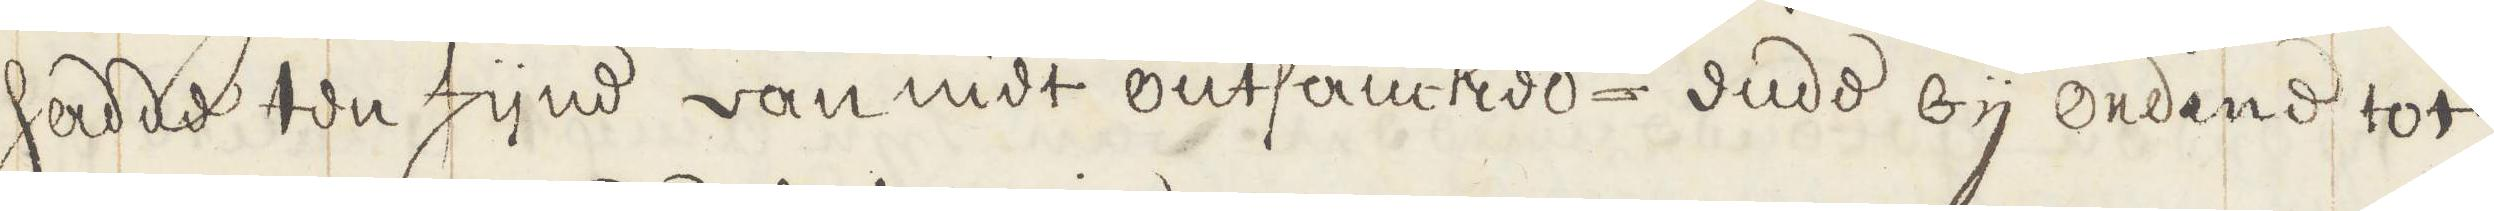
hadde ten fijne van niet ontfanckel=ne ende bij ordine tot
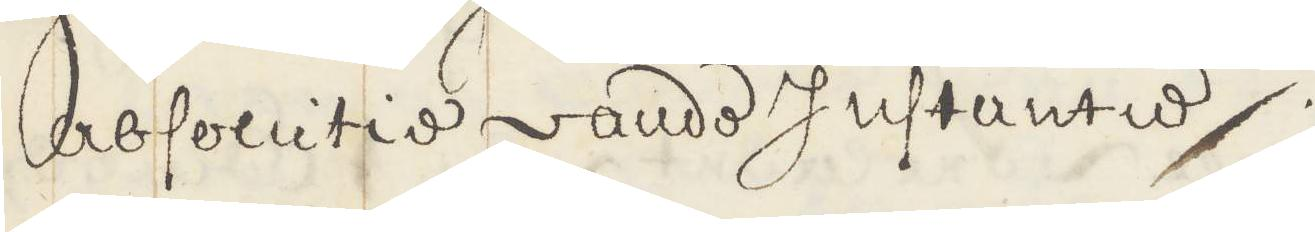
absolutie vande Jnstantie/.
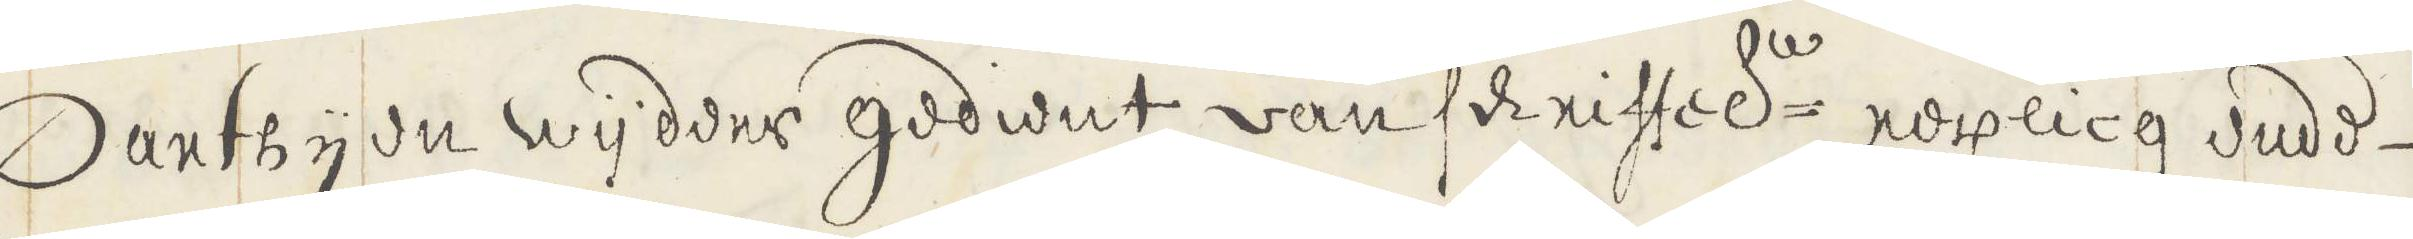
Parthijen wijders gedient van schriftel=e replicq ende—
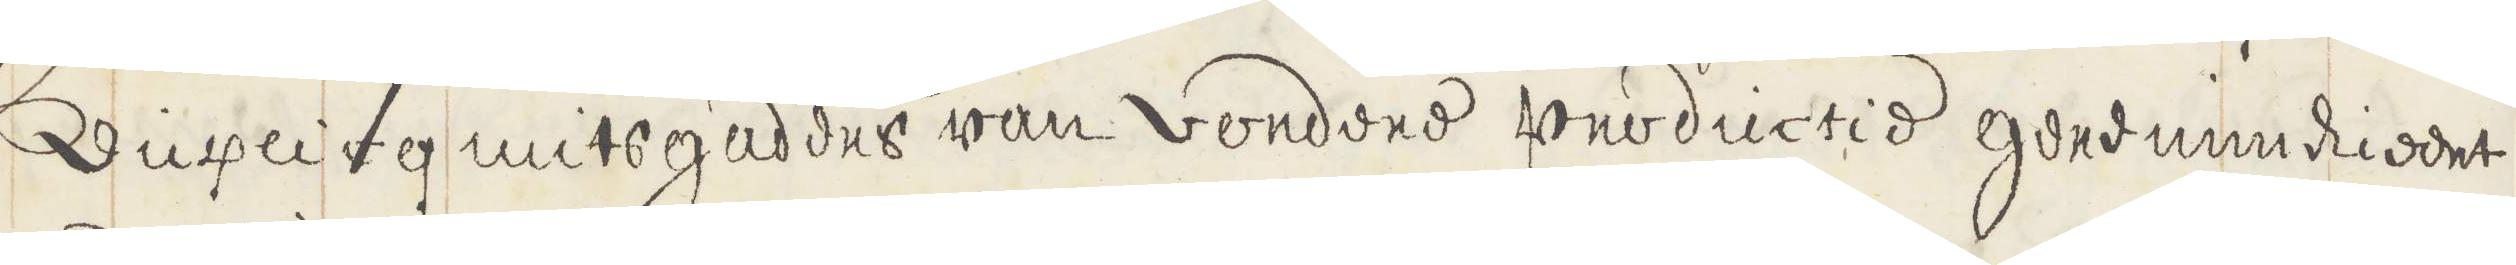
duplicq mitsgaders van vordere productie gerenunchieert
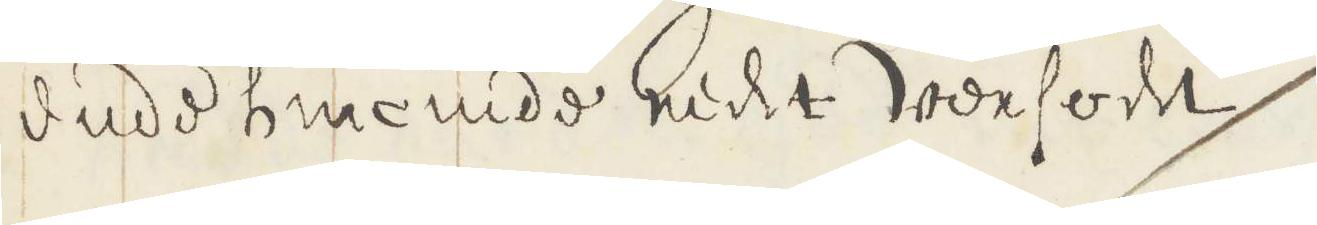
ende hinc iude recht versocht/
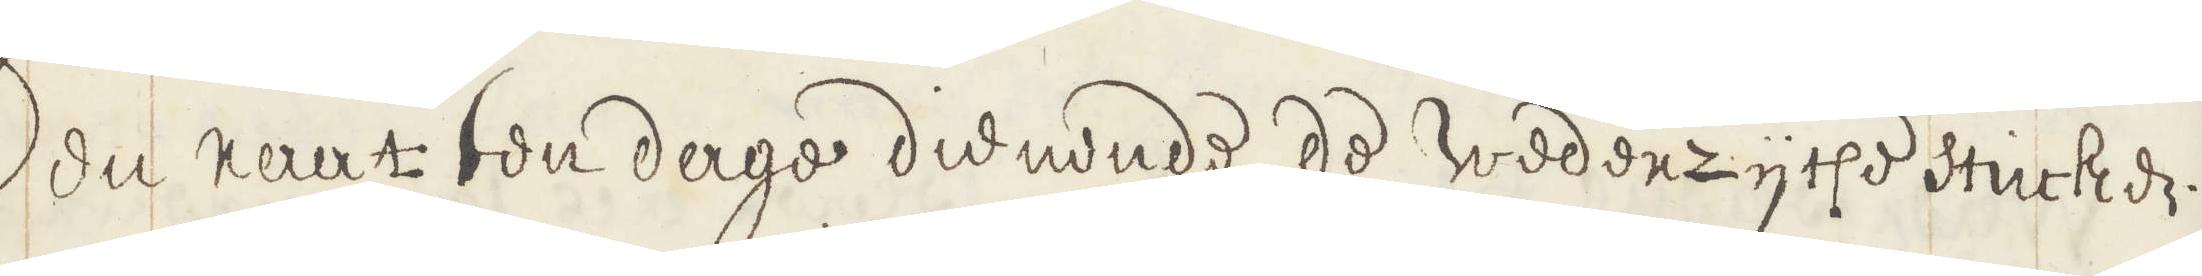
en raat ten dage dienende de wederzijtse stucken
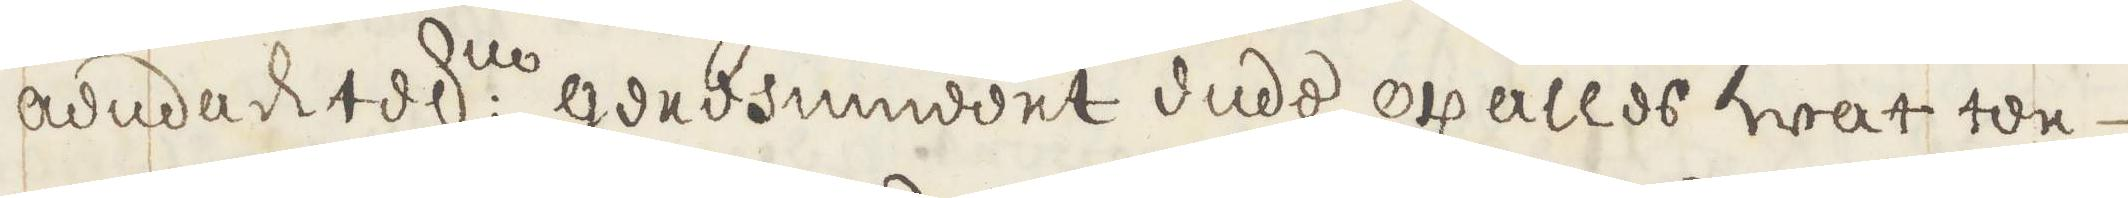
aendach te h:n geresumeert ende op alles wat ter
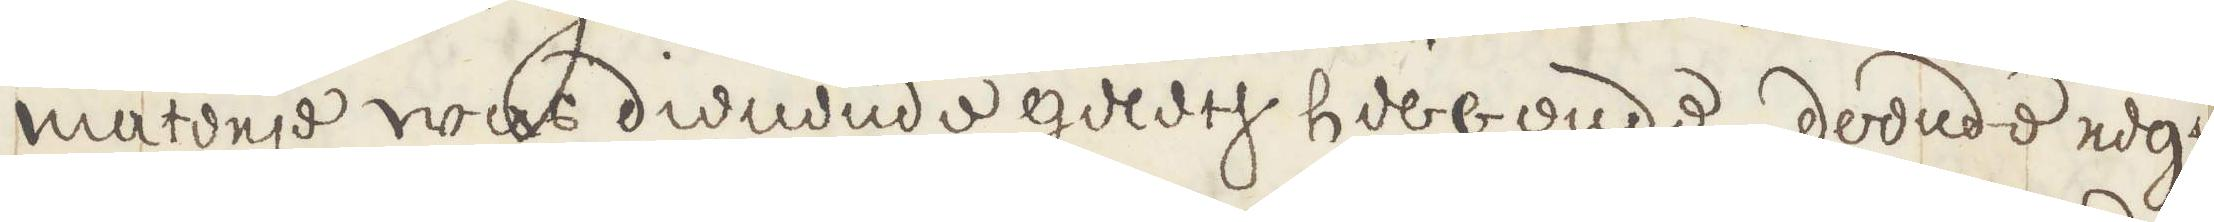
materje was dienende geleth hebbende doende regt
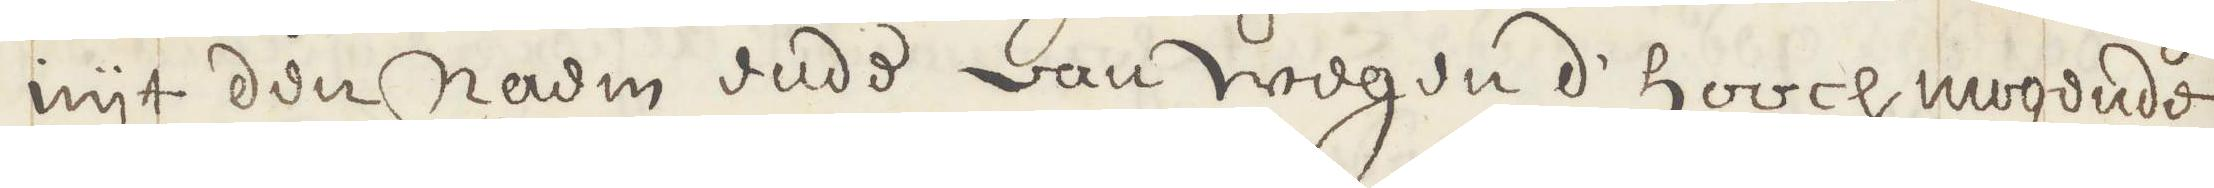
uijt den naem ende van wegen d’ hooch mogende
